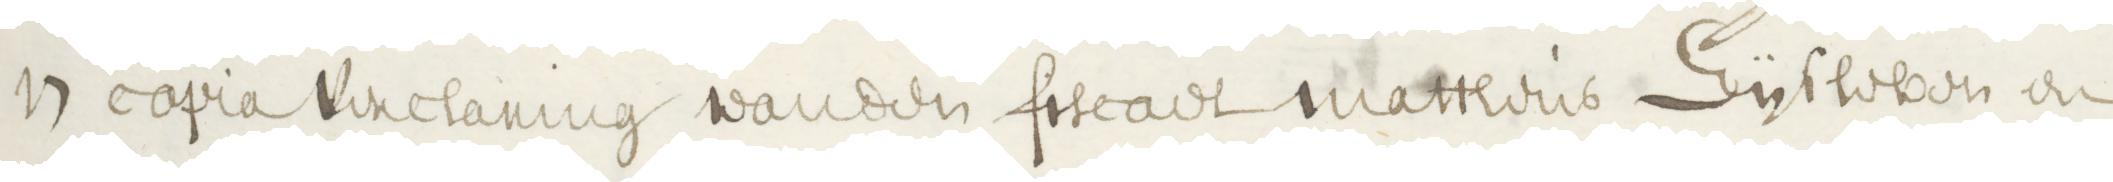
17 copia Verclaring van den fiscael mattheus Eijsleben en
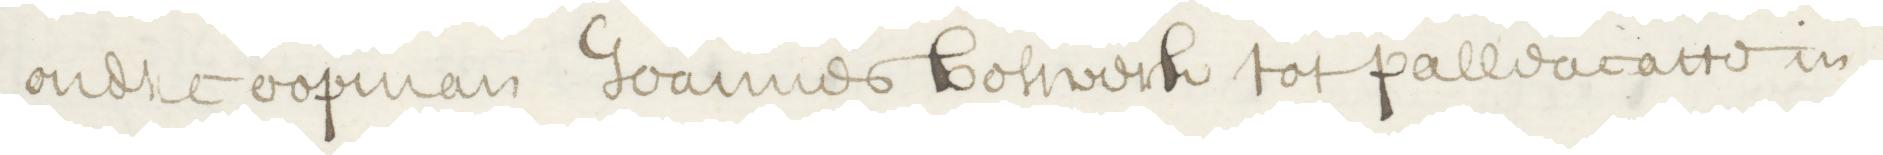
ondr coopman Ioannes boswerk tot palleacatte in
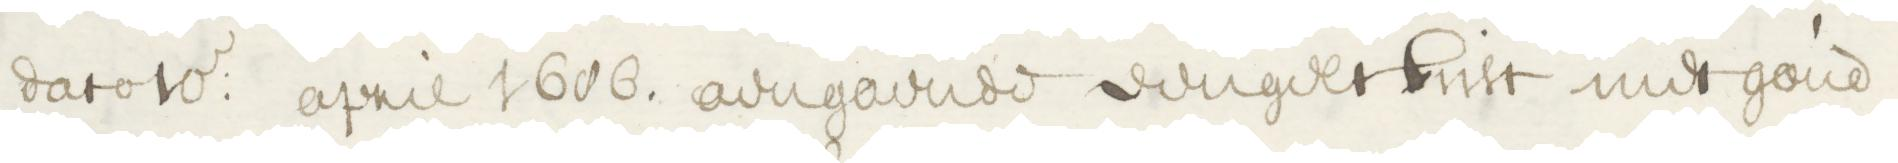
dato 10:e april 1686. aengaende een geltkist met goud
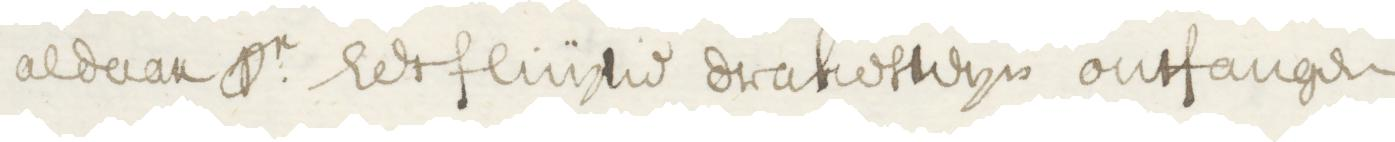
aldaar p:r het fluijtie drakesteijn ontfangen
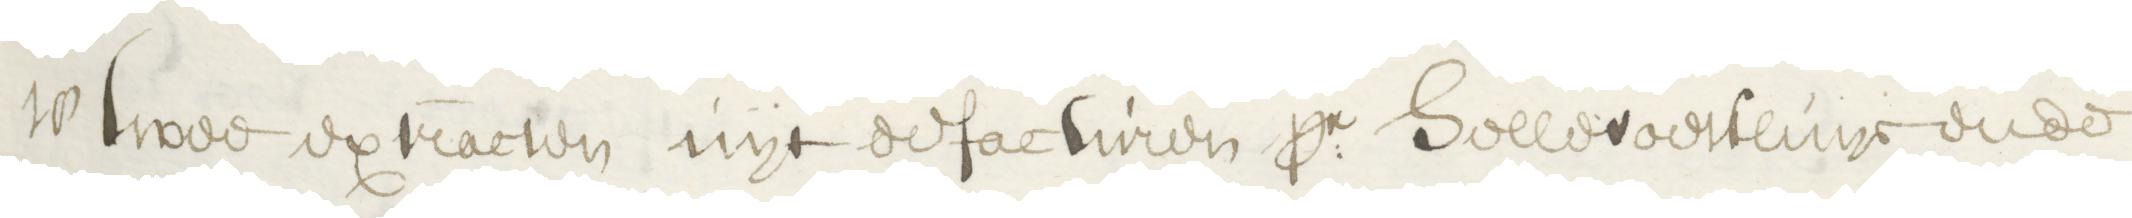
18 twee extracten uijt de facturen p:r Hellevoetslluijs ende
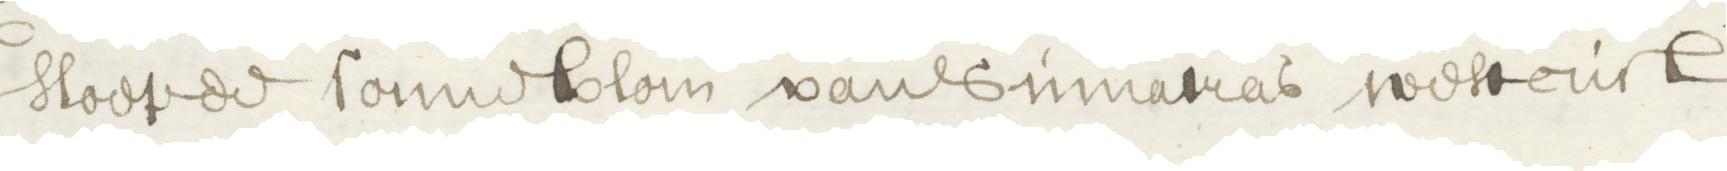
sloep de sonneblom van sumatras westcust
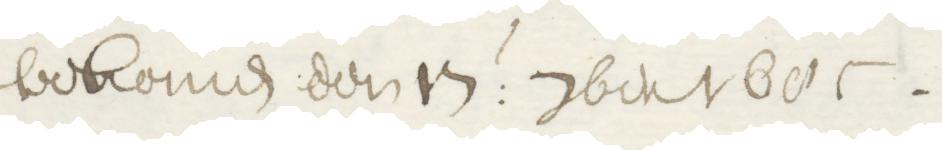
bekomen den 17:' 7ber 1685.
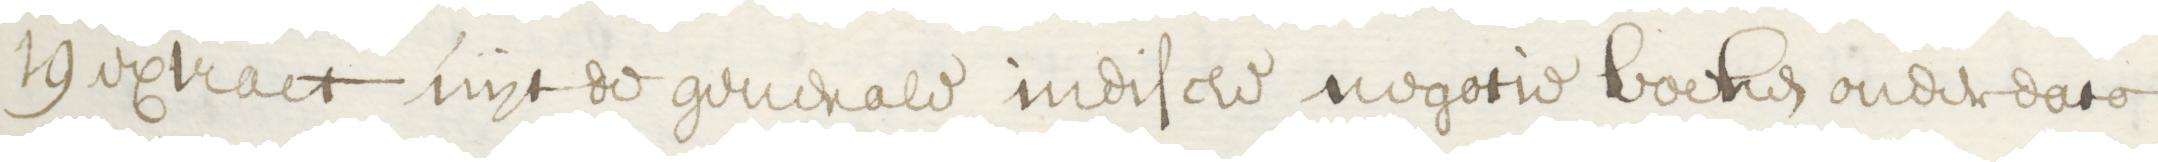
19 extract uijt de generale indische negotie boeken onder dato
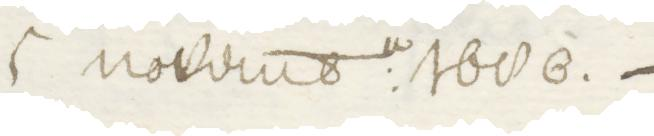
5 novemb:r 1686.
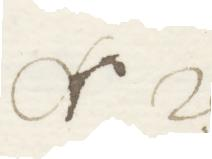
No 2
